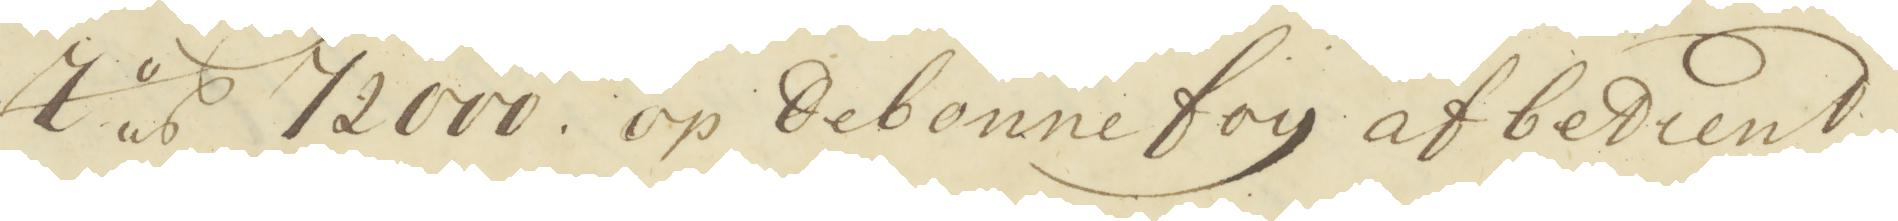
R o/as 72000. op de bonnefoij afbediend
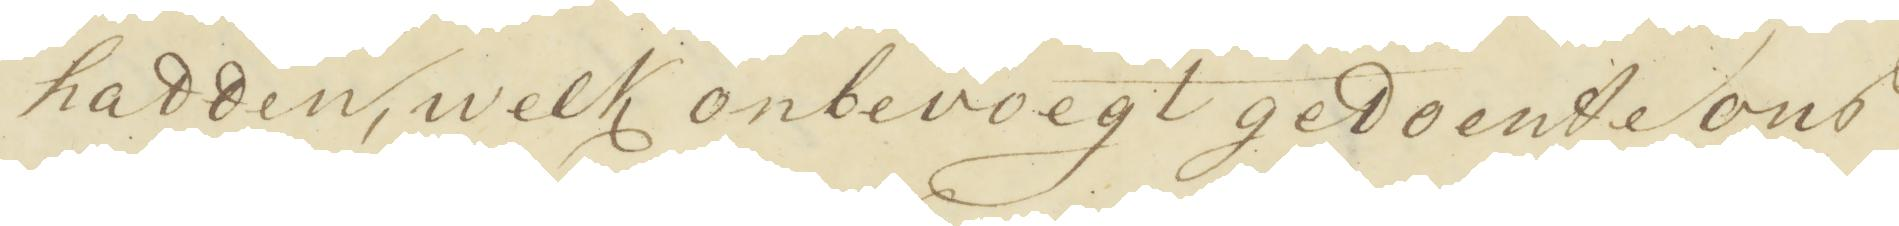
hadden, welk onbevoegt gedoente ons
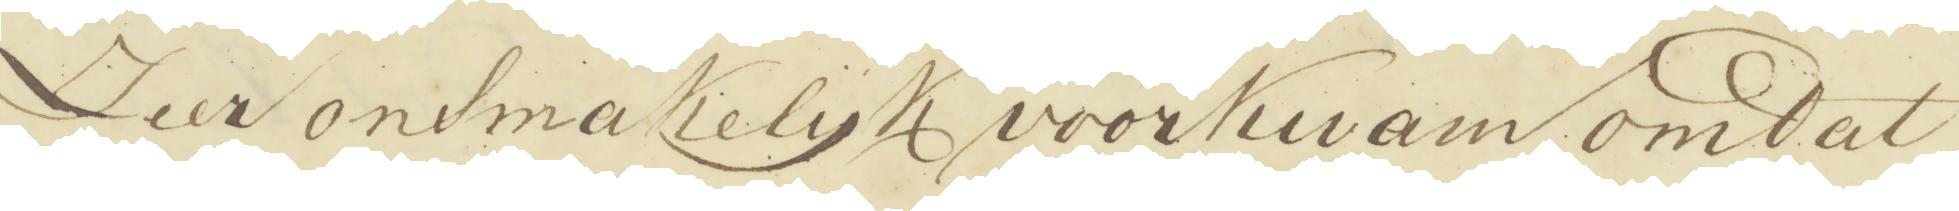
Zeer onsmakelijk voorkwam, omdat
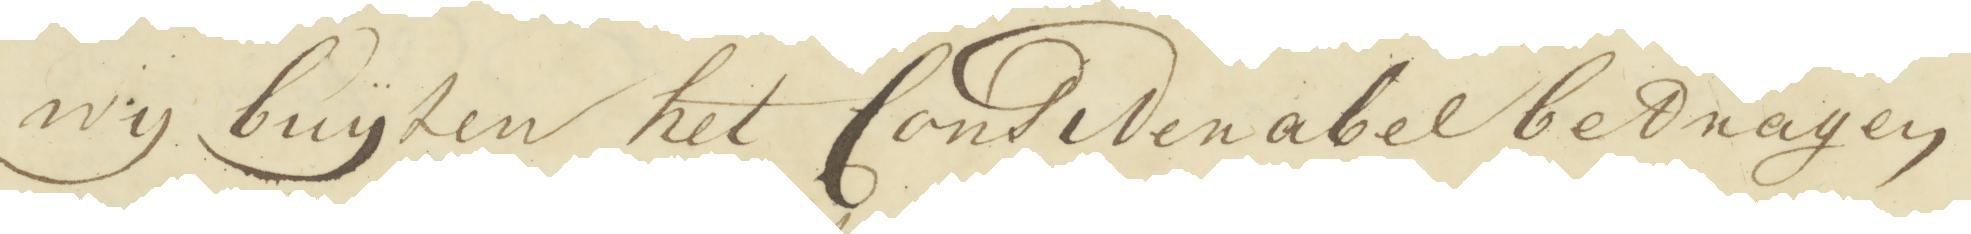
wij buijten het Considerabel bedrag en
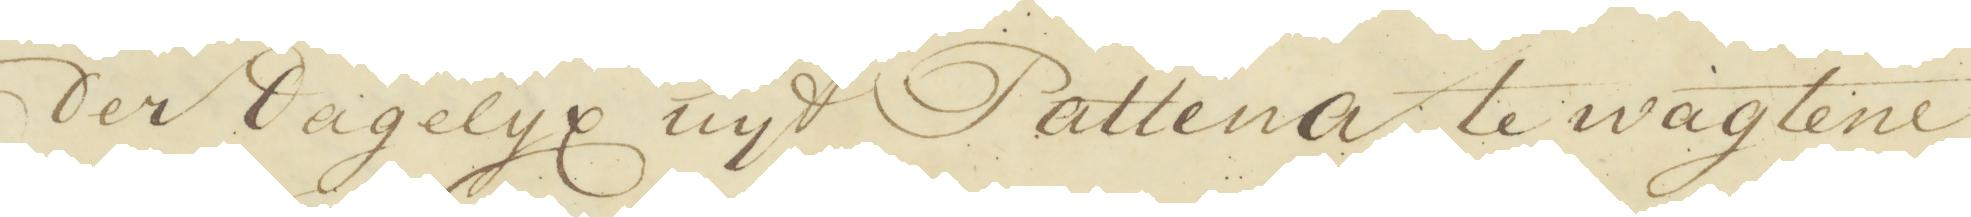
der dagelijx uijt Pattena te wagtene
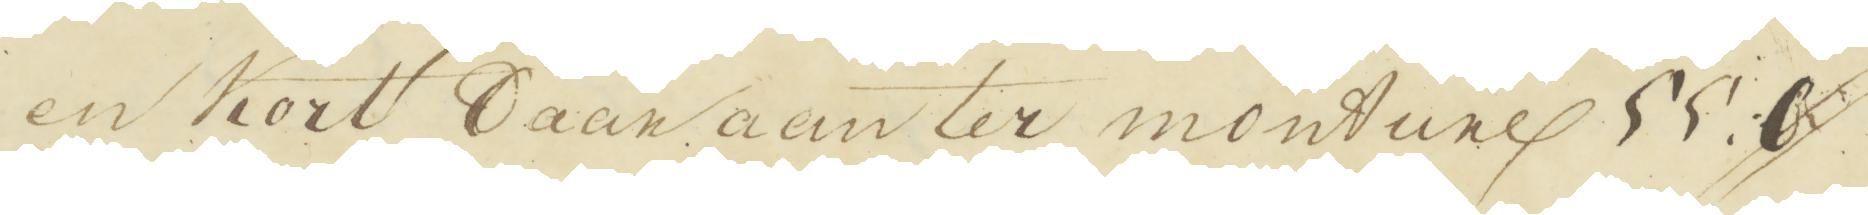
en Kort daaraan ter monture 55: Ø
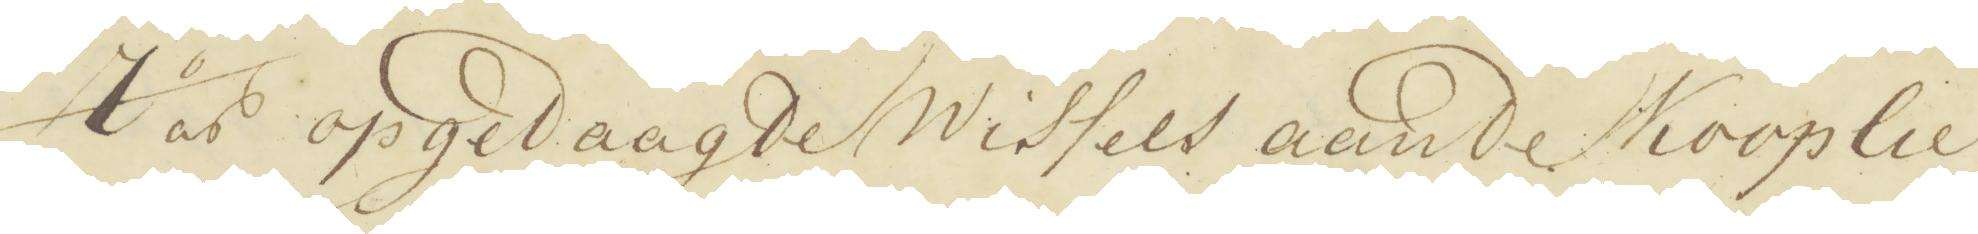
R o/as opgedaagde Wissels aan de Kooplie
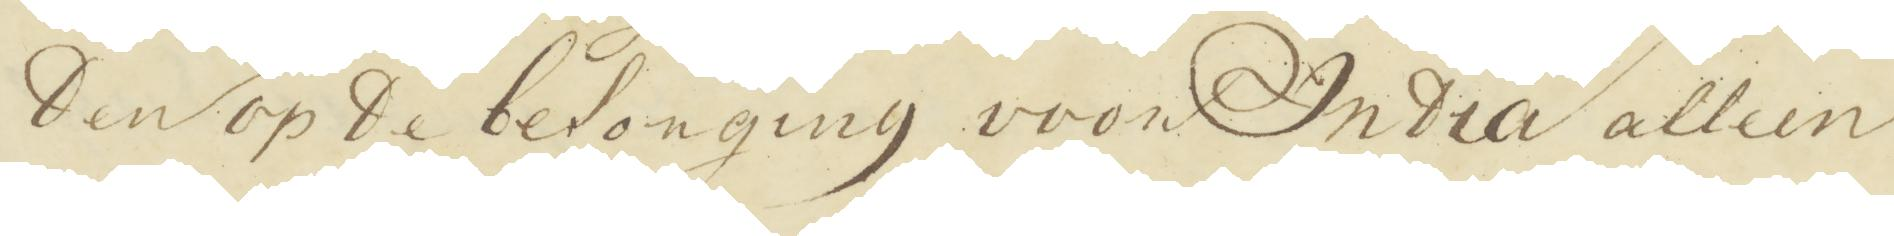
den op de besorging voor India alleen
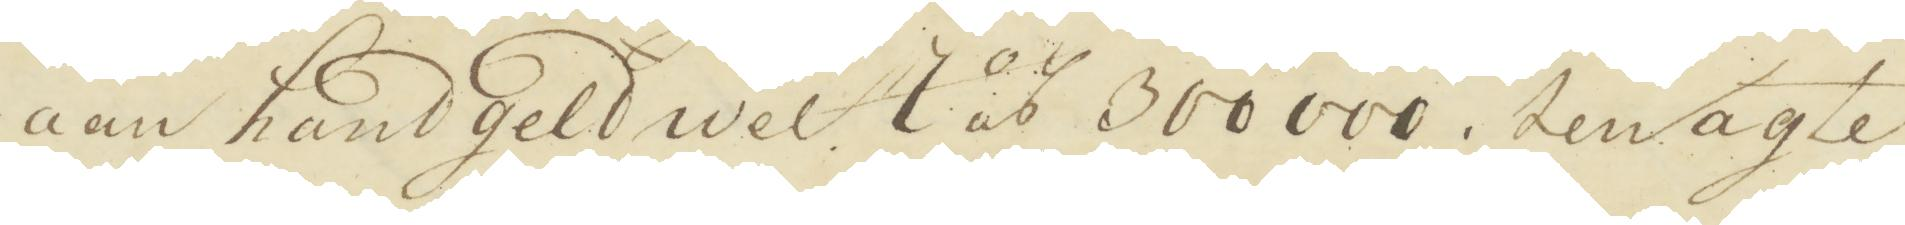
aan handgeld wel R o/as 300 000, ten agte
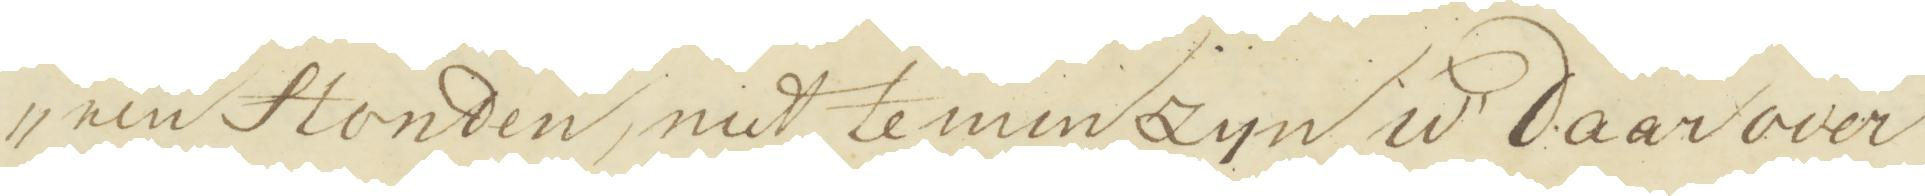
„ren stonden, niet temin zijn w' daarover
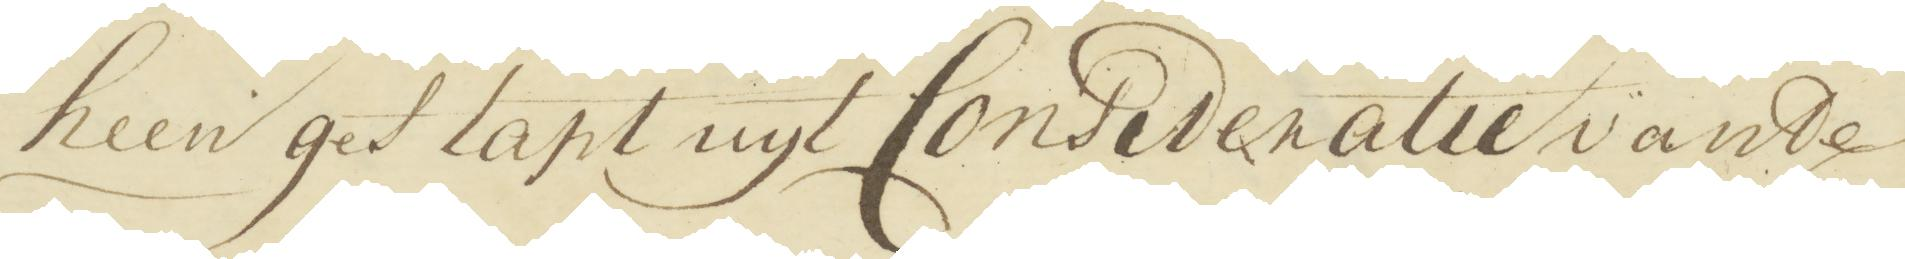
heen gestapt uyt Consideratie van de
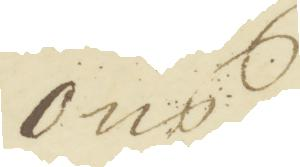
ons:
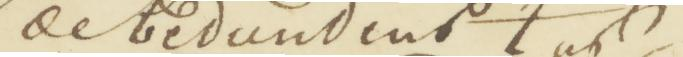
de bediendens R o/a„
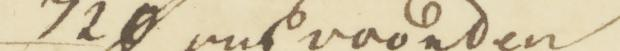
72Ø ons voor den
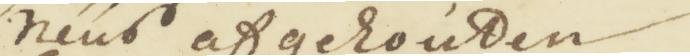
neus afgehouden
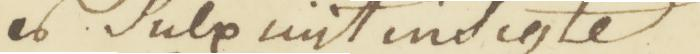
is sulx uijt insigte
